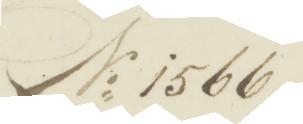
N„o 1566.
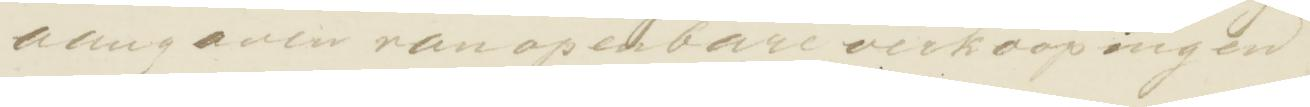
aangaven van openbare verkooping en
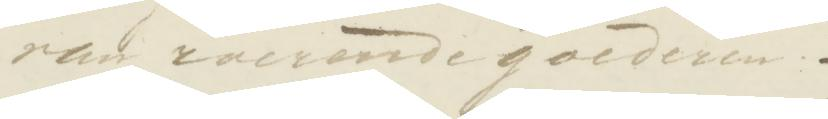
van roerende goederen:
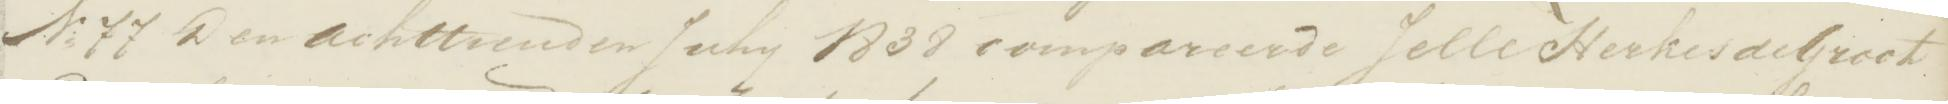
N=o 77 Den achttienden Julij 1838 compareerde Jelle Herkes de Groot
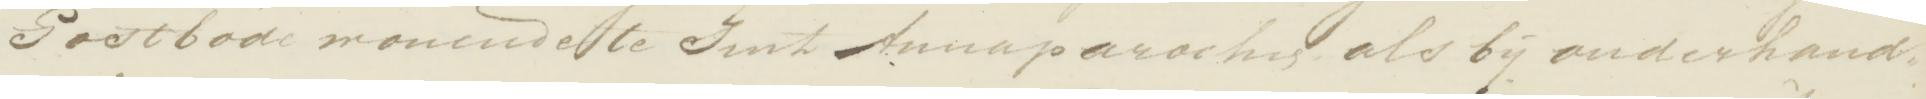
Postbode wonende te Sint Annaparochie als bij onderhand„
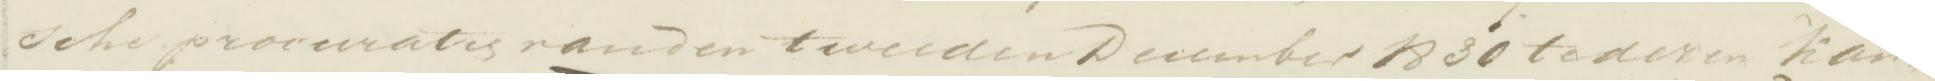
sche procuratie van den tweeden December 1830 te dezen kan
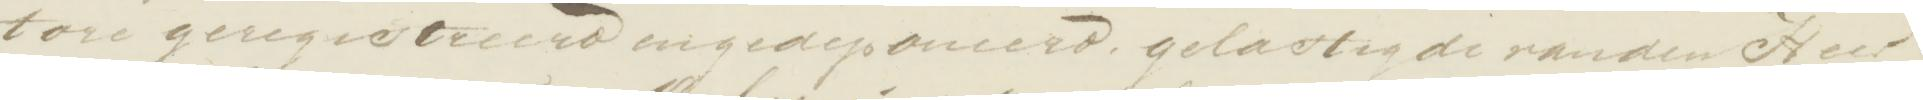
tore geregistreerd en gedeponeerd, gelastigde van den Heer
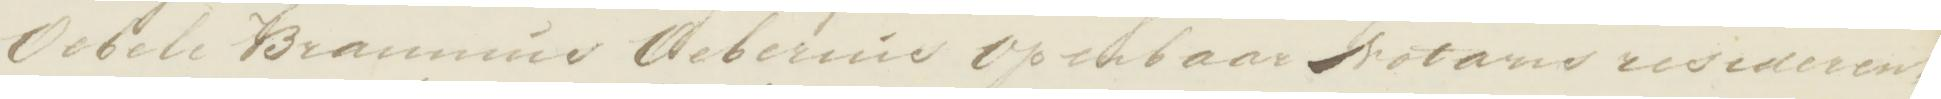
Oebele Braunius Oeberius Openbaar Notaris resideren„
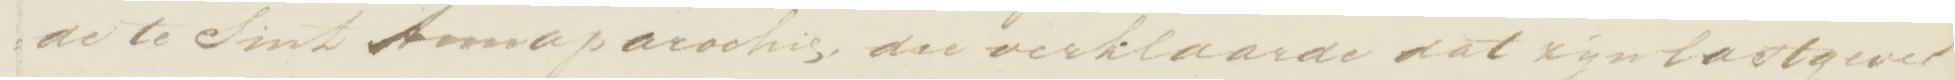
„de te Sint Annaparochie, die verklaarde dat zijn lastgever
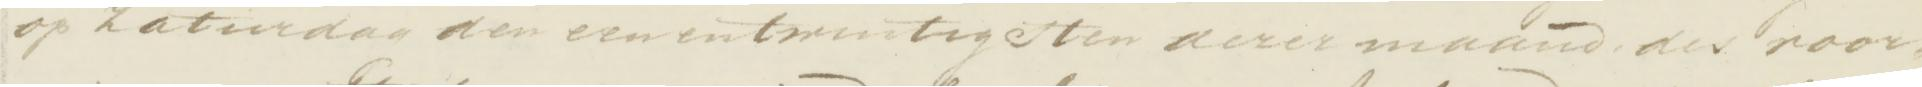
op zaturdag den een en twintigsten dezer maand, des voor
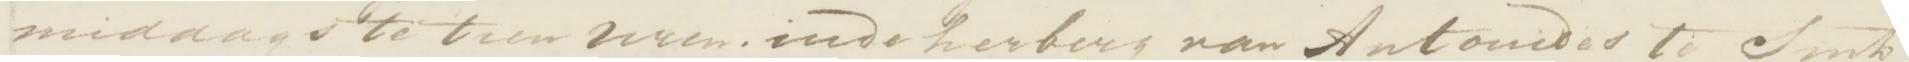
middags te tien uren, inde herberg van Antonides te Sint
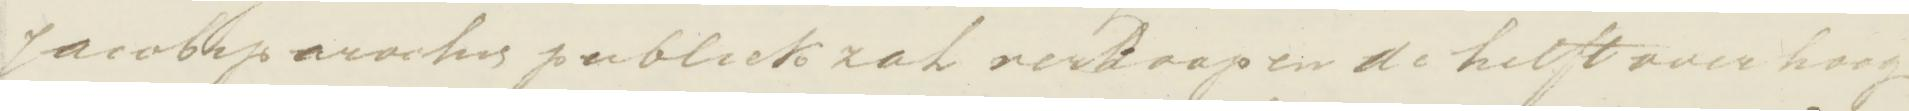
Jacobiparochie publiek zal verkoopen de helft over hoog
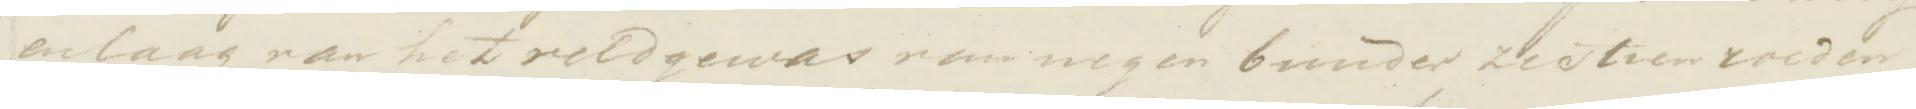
en laag van het veldgewas van negen bunder zestien roeden
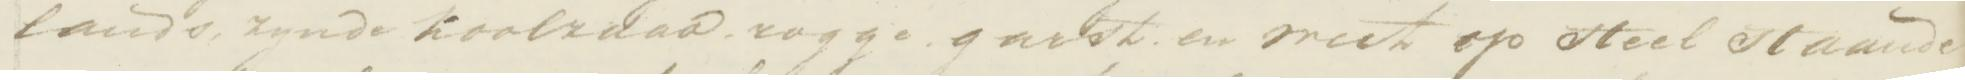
lands, zynde koolzaad, rogge, garst en weit op steel staande
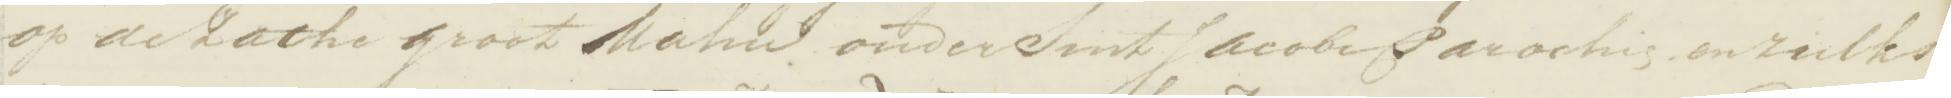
op de zathe groot Mahu onder Sint Jacobi Parochie, en zulks
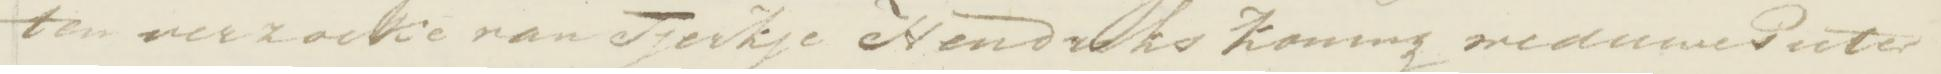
ten verzoeke van Tjerkje Hendriks Koning weduwe Pieter
